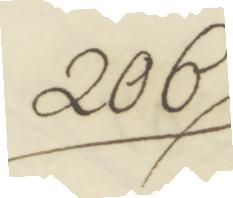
206
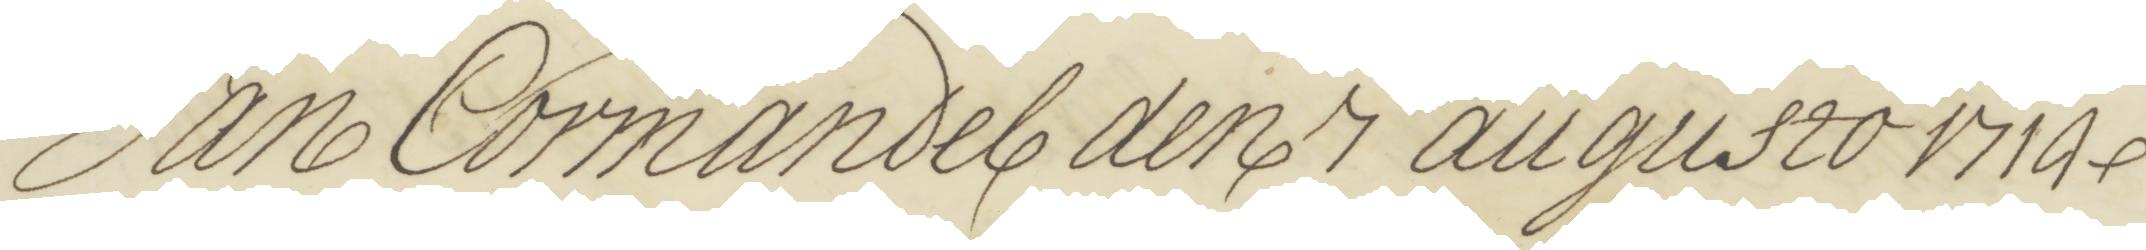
Van Cormandel den 7de augusto 1714 —
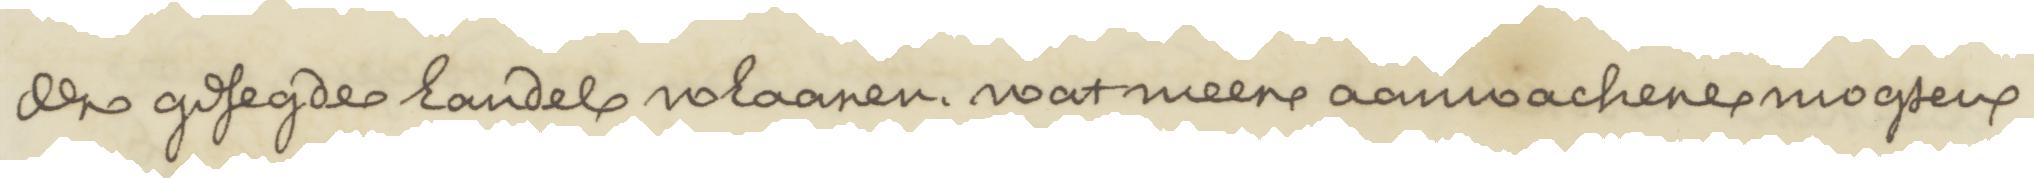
der gesegde handel whaaren, wat meer aanwackere mogten
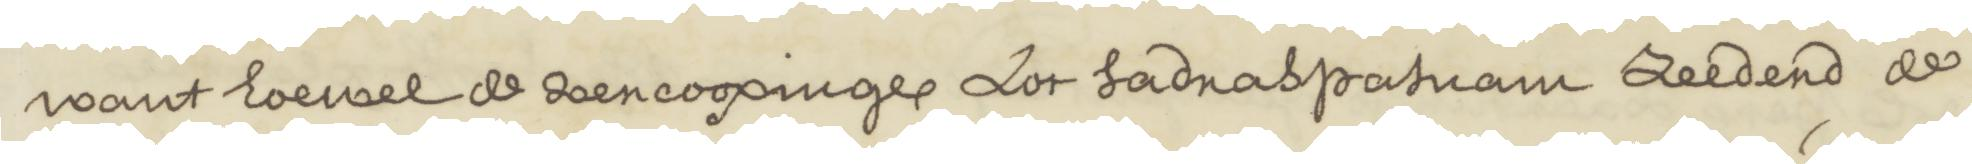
want hoewel de vercoopinge tot sadraspatnam zeederd de
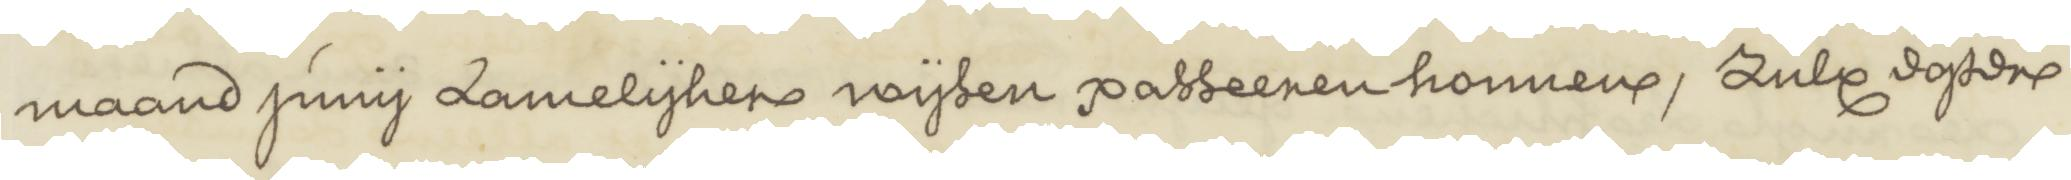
maand junij tamelijker wijsen passeeren konnen, zulx egter
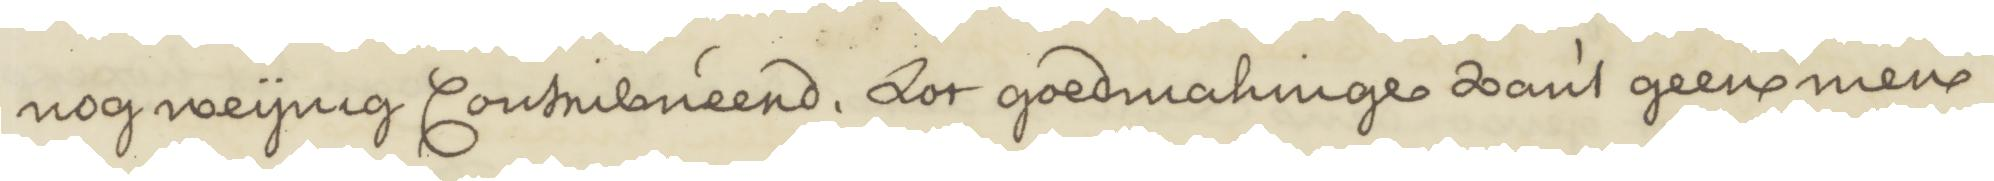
nog weijnig Contribueerd, tot goedmakinge van't geen men
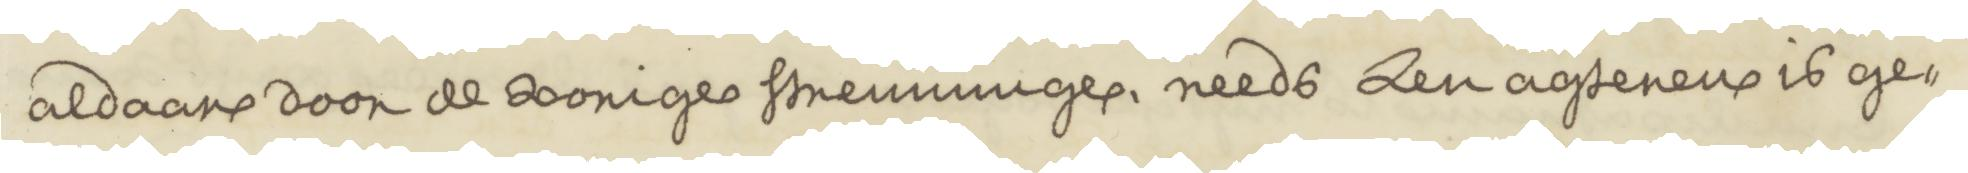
aldaar door de vorige strenminge, reeds ten agteren is ge„
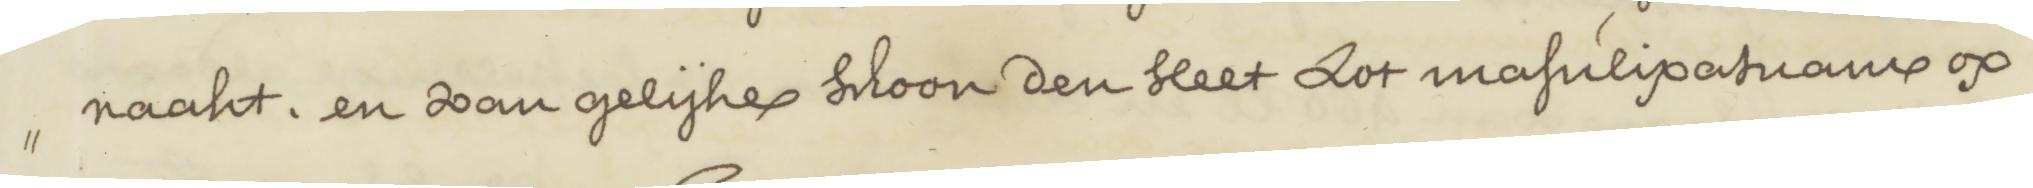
„raakt, en van gelijke schoon den sleet tot masulipatnam op
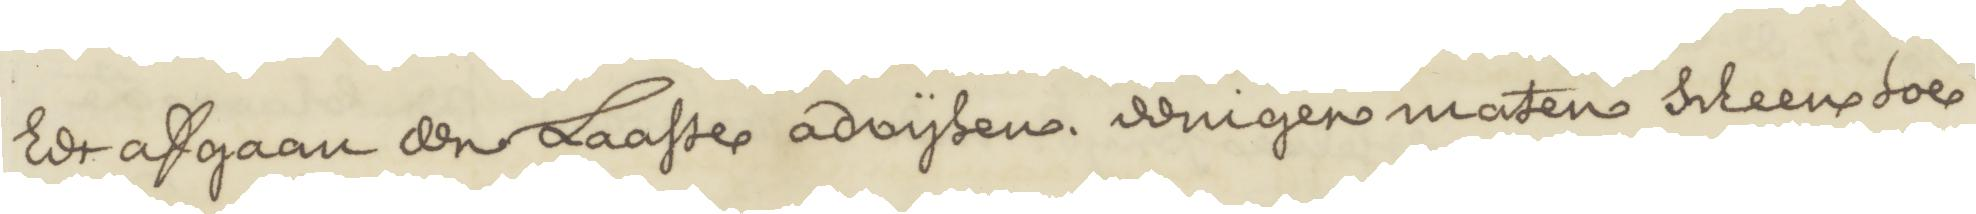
het afgaan der Laaste advijsen eeniger maten scheen toe
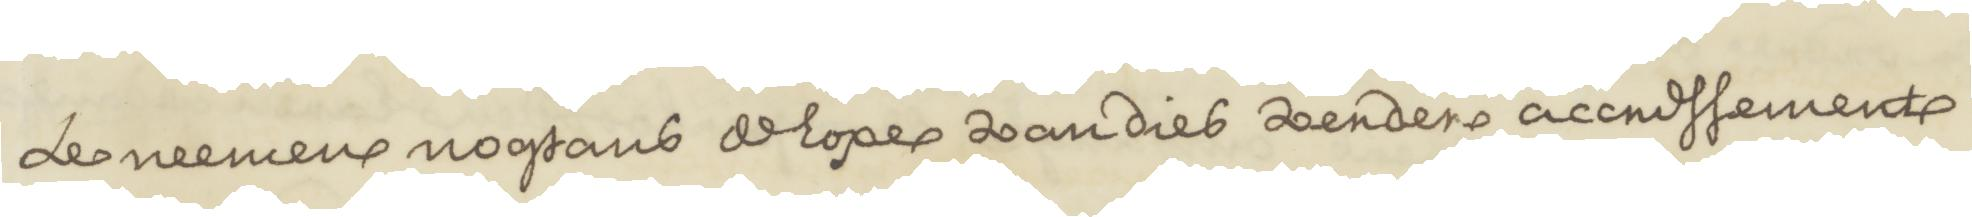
te neemen nogtans de hope van dies verder accressement
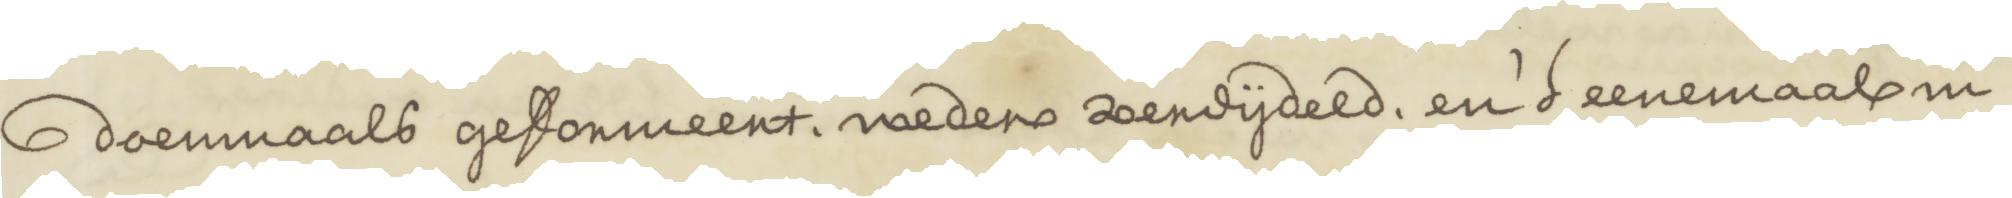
doenmaals geformeert, weder vereijdeld, en 'd eenemaal in
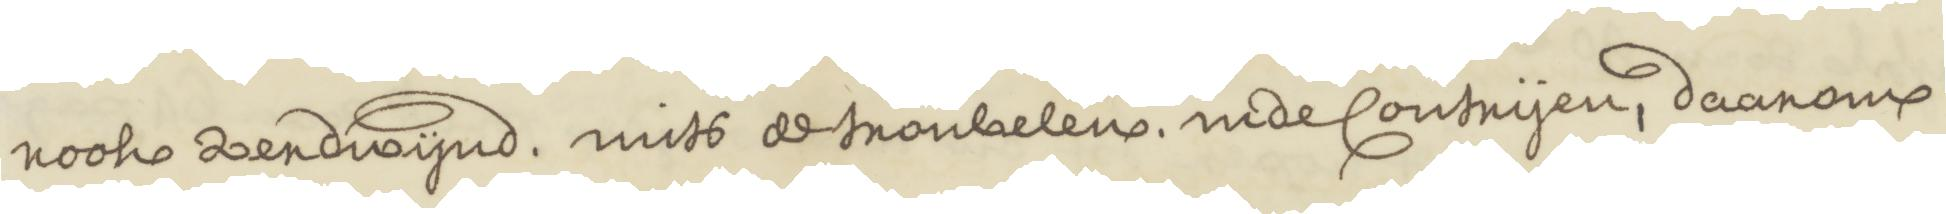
rook verdwijnd, mits de troubelen, in de Contrijen, daarom
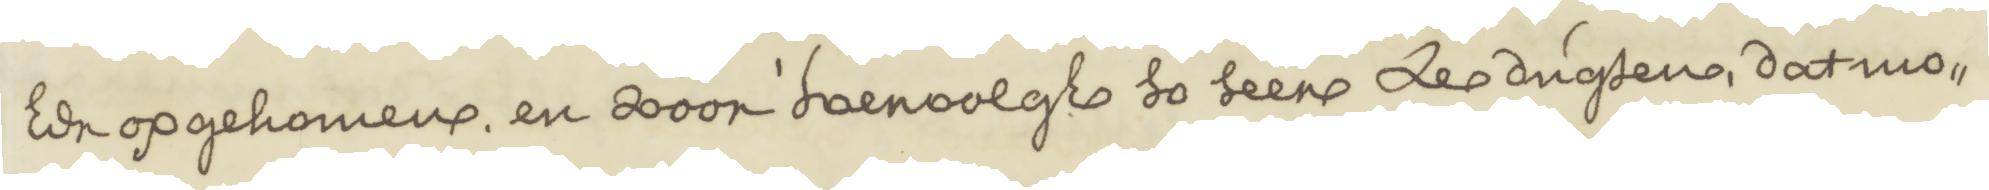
her op gekomen, en voor 'tvervolgh so seer te dugten, dat mo„
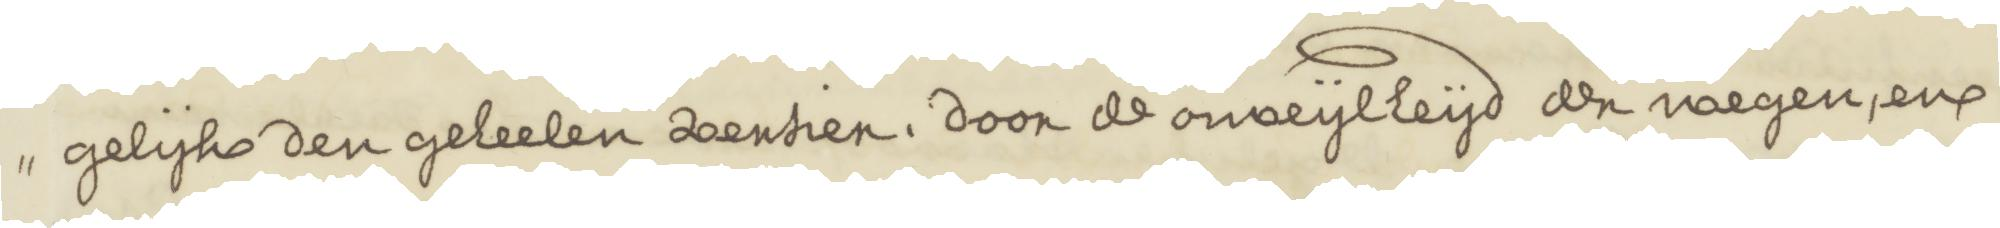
„gelijk den geheelen vertier, door de onveijlheijd der wegen, en
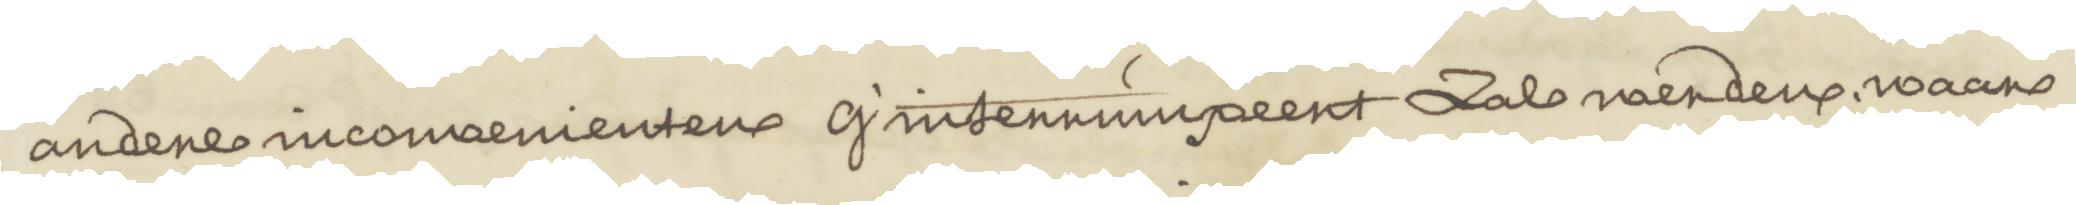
andere inconvenienten g'interrumpeert Zal werden, waar
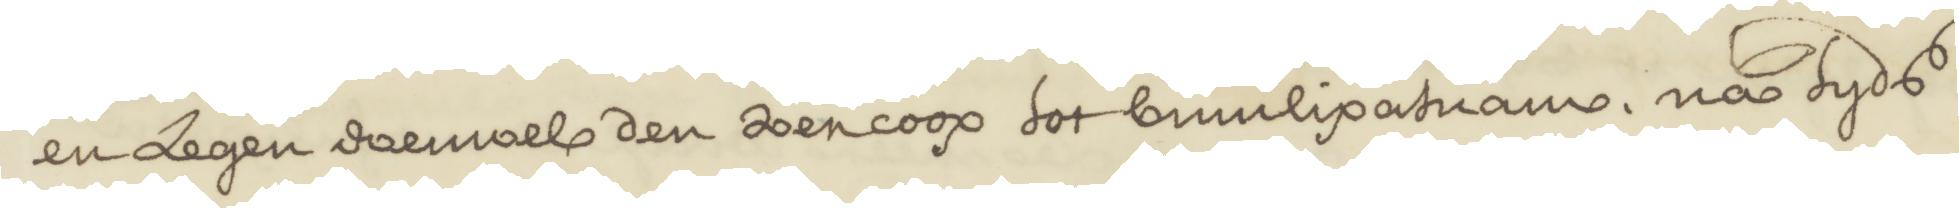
en tegen evenwel den vercoop tot bimilipatnam, na tyds
